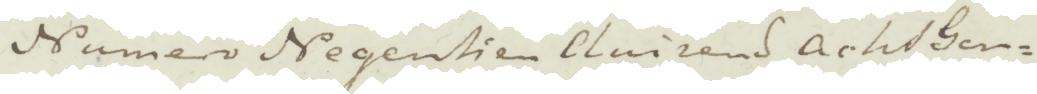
Numero Negentien duizend acht hon„
